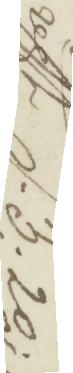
regt ƒ 3. 20
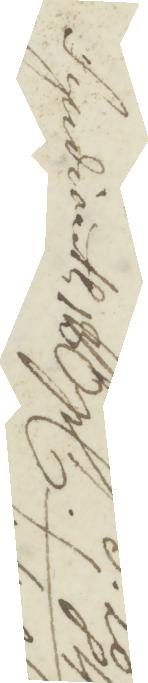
Syndicaath 12 opC: 84
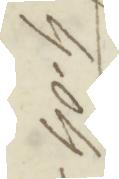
ƒ 4.04-
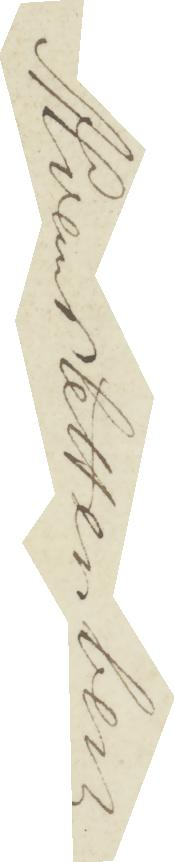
AlvanPlettenberg
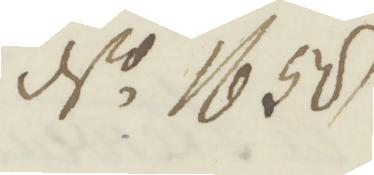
N„o 1658
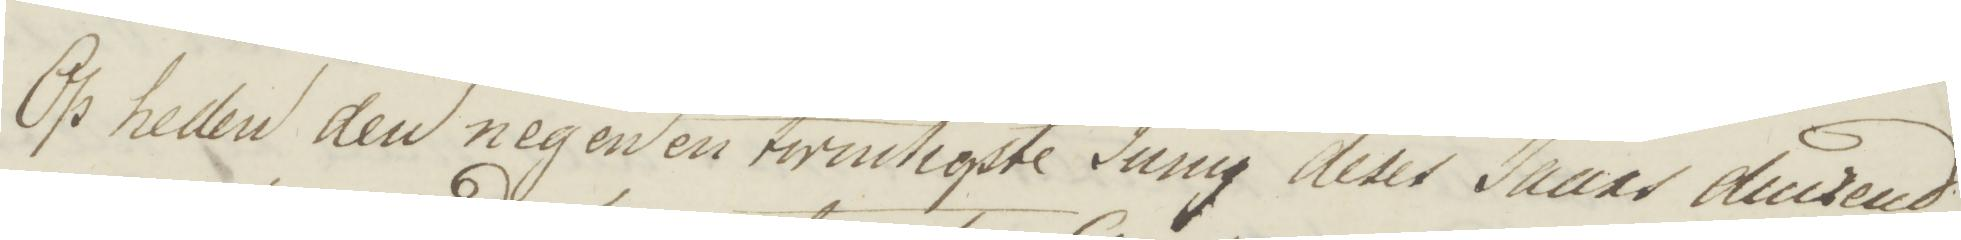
Op heden den negen en twintigste Iuny dezes Iaars duizend
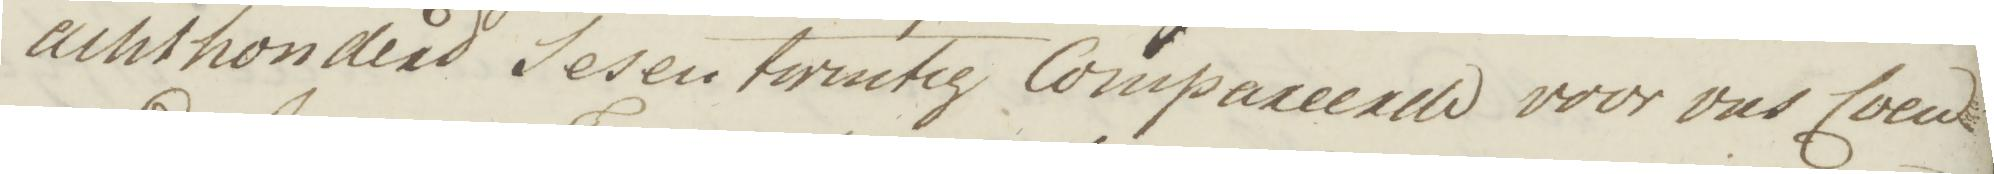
achthonderd ses en twintig Compareerde voor ons Coen-
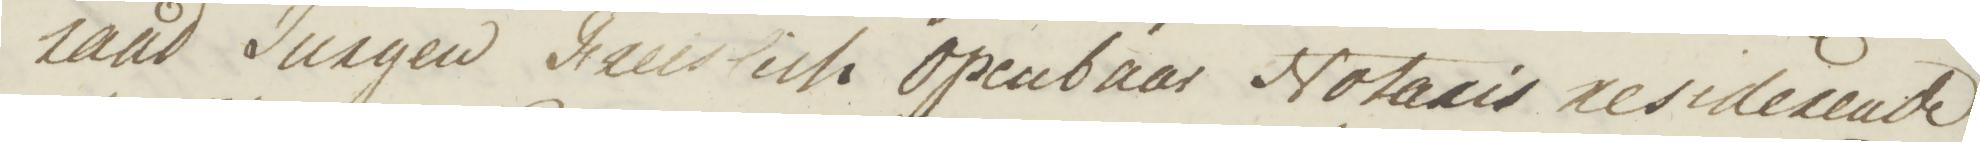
raad Iurgen Freitlich Openbaar Notaris residerende
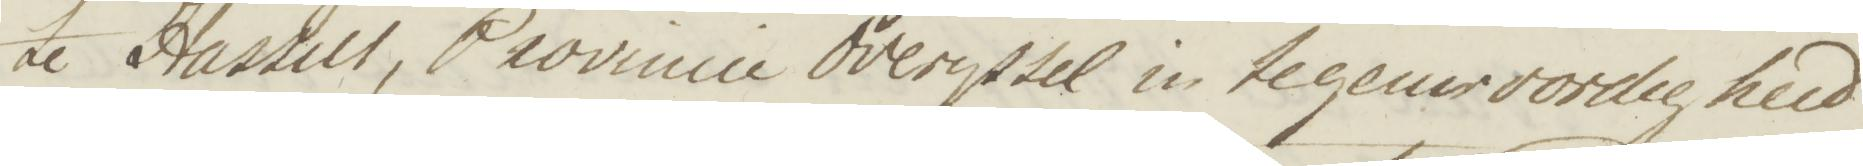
te Hasselt, Provincie Overyssel in tegenwoordigheid
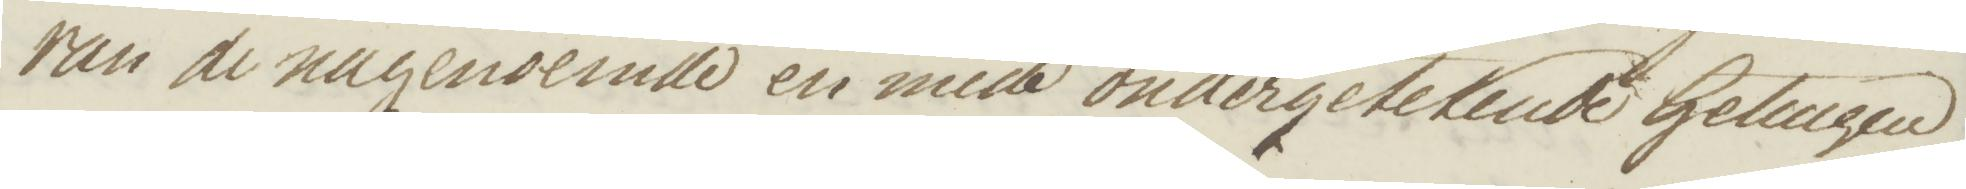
van de nagenoemde en mede ondergetekende Getuigen
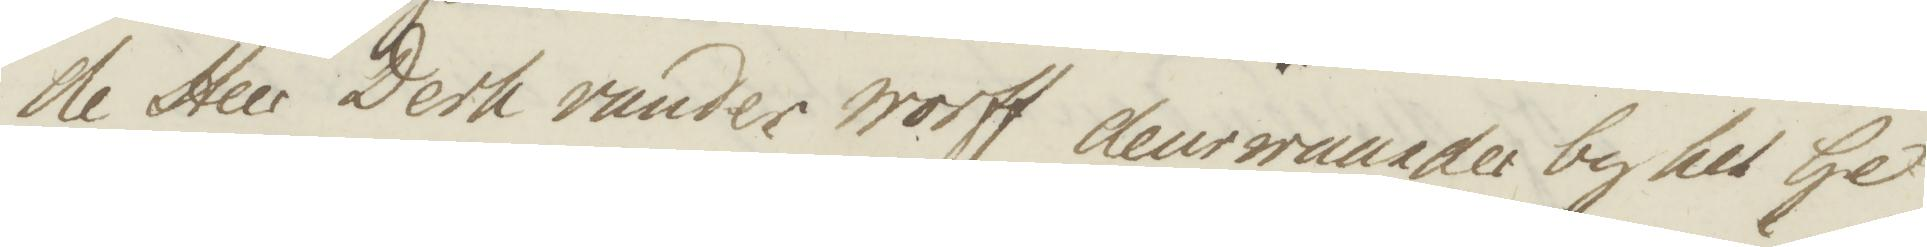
de Heer Derk vander Worff deurwaarder by het Ge
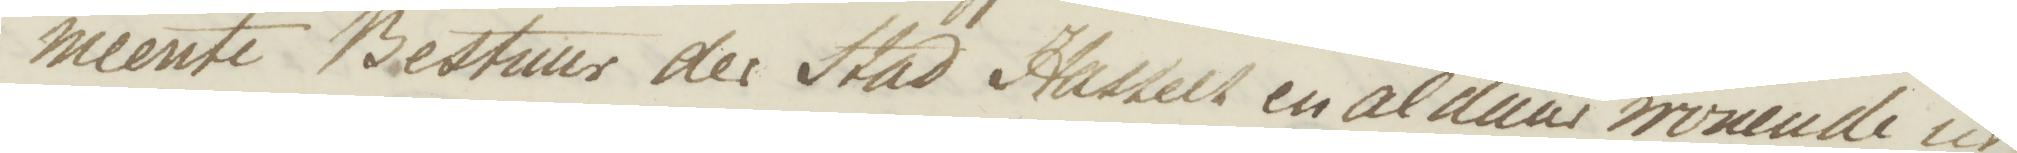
meente Bestuur der Stad Hasselt en aldaar wonende in
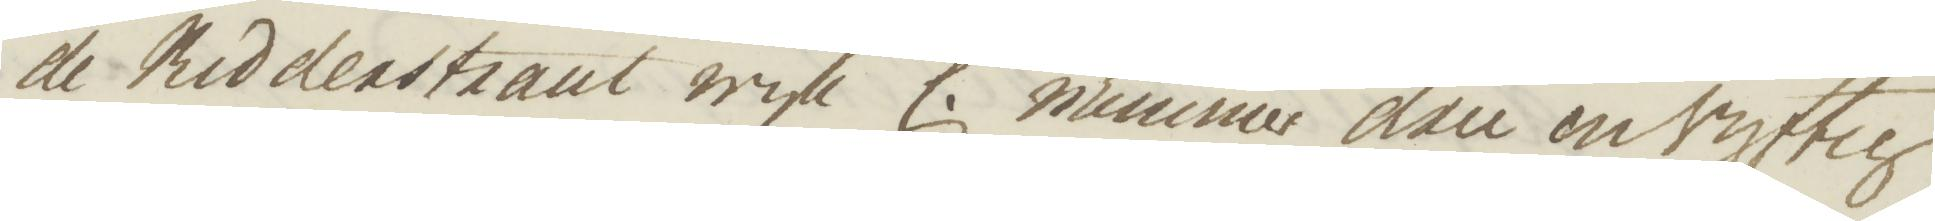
de Ridderstraat wyk C. nummer drie en vyftig
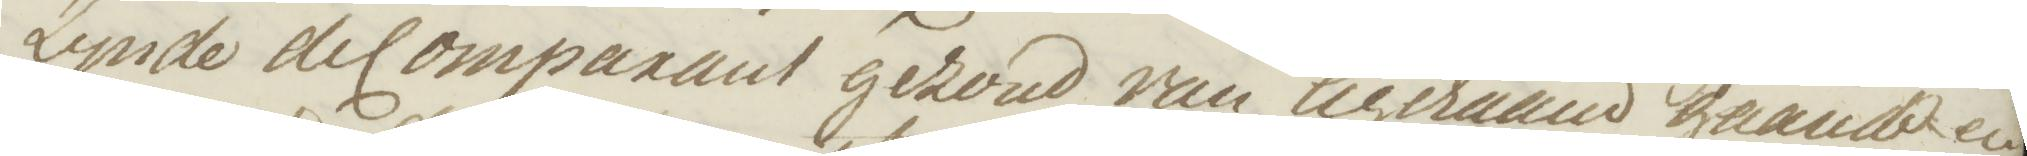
Zynde de Comparant gezond van lichaam gaande en
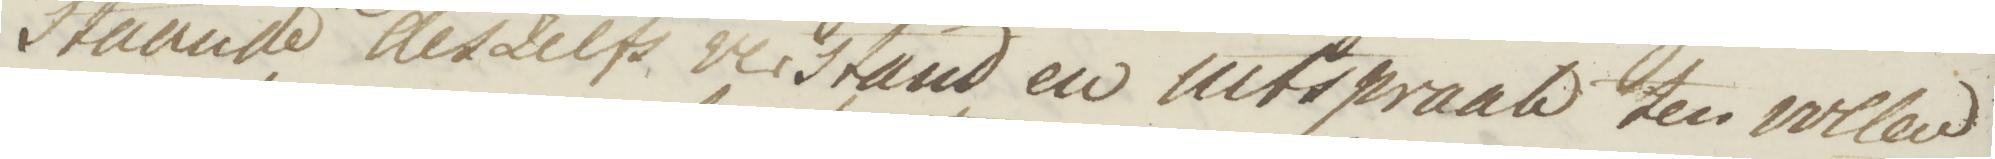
staande deszelfs verstand en uitspraat ten vollen
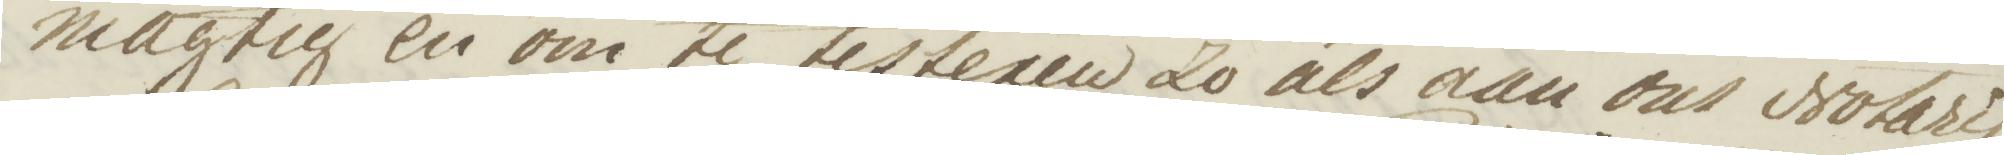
magtig en om te testeren zo als aan ons Notaris
